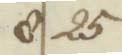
8 25
